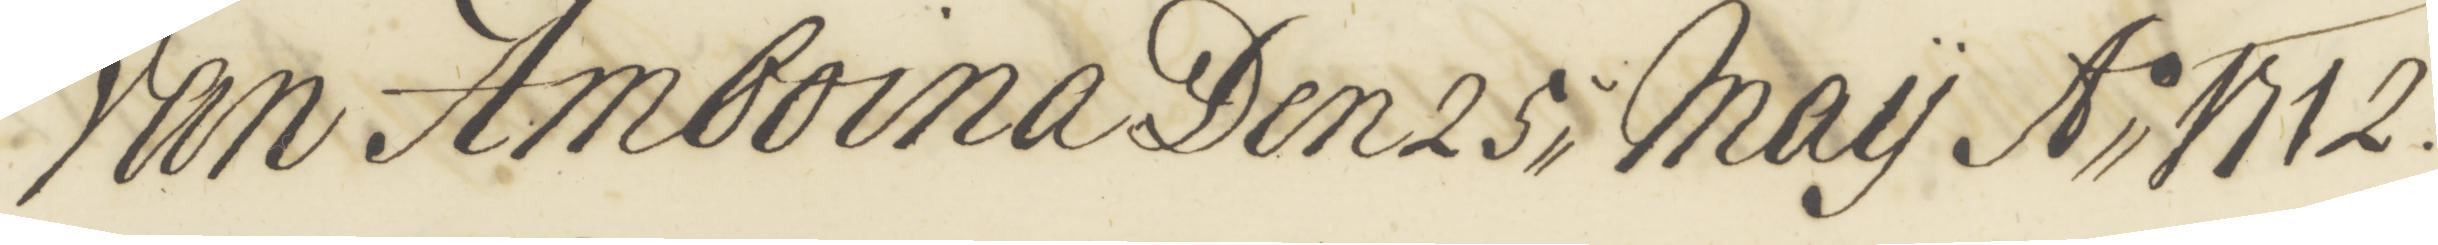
Van Amboina Den 25„e Maij A„o 1712
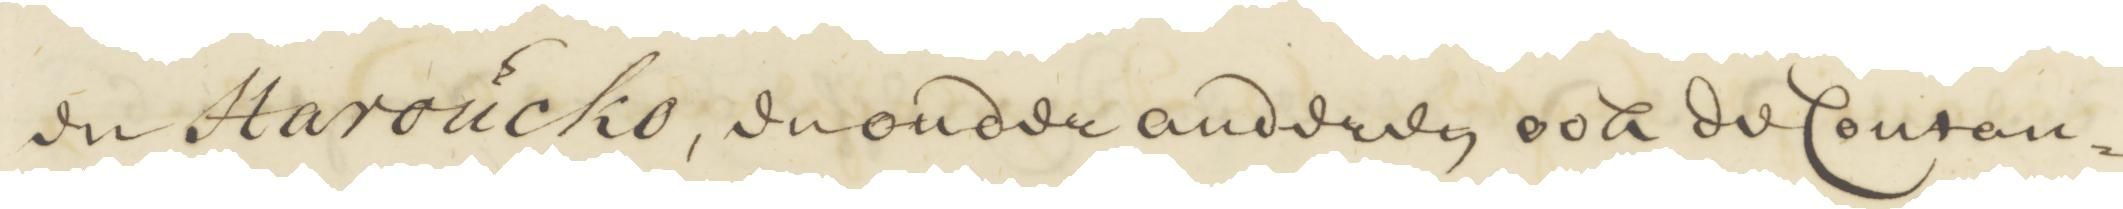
en Haroucko, en onder anderen ook de Contan„
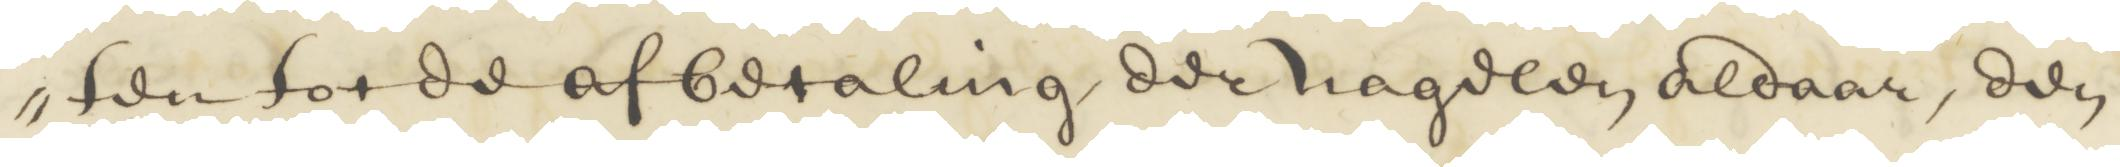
„ten tot de afbetaling, der nagelen aldaar, den
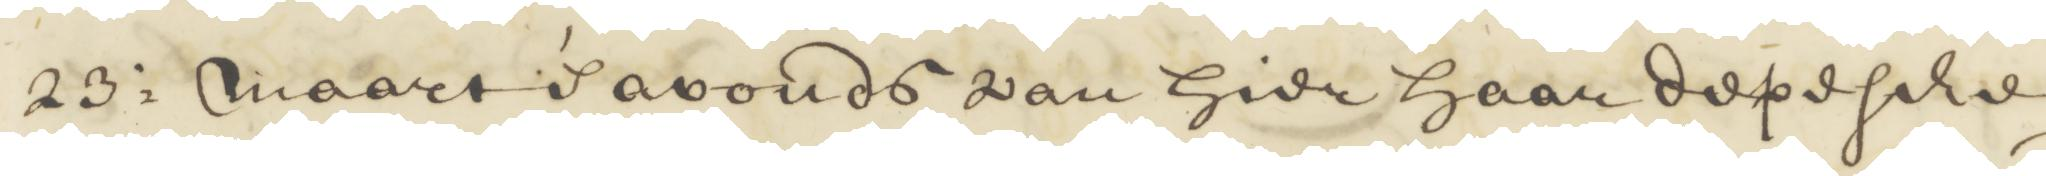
23„' Maart 's avonds van hier haar depesche
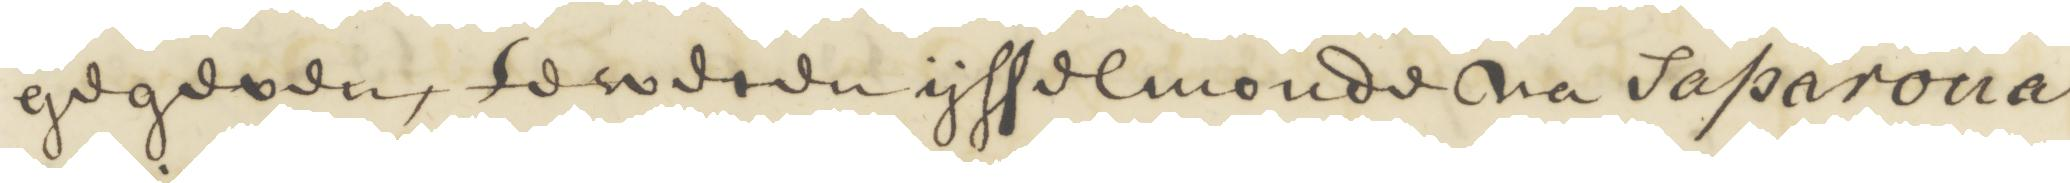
gegeven, te weten ijsselmonde na saparoua
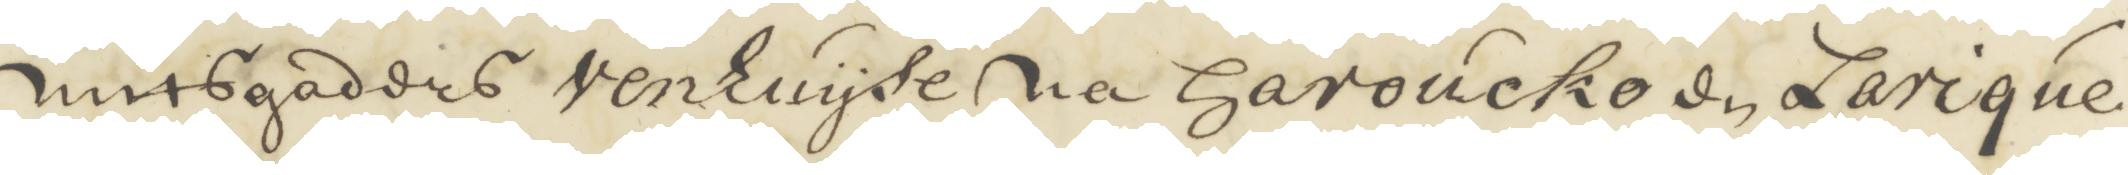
mitsgaders Venhuijse na Haroucko en Larique
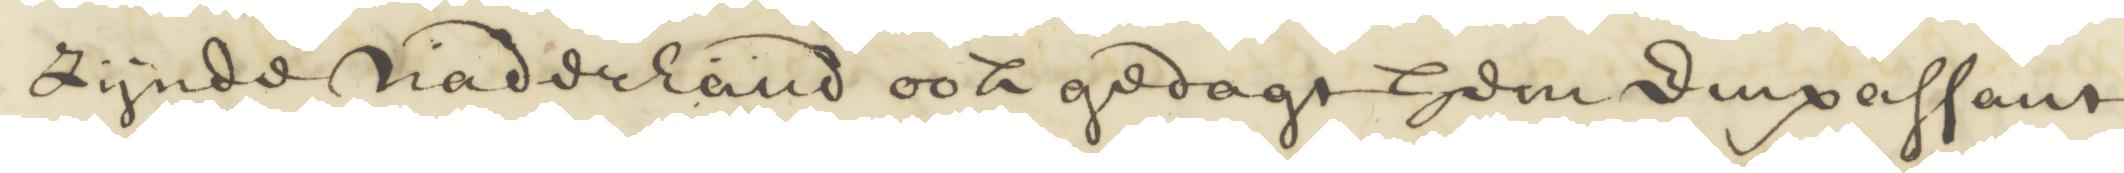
zijnde naderhand ook gedagt hem Empassant
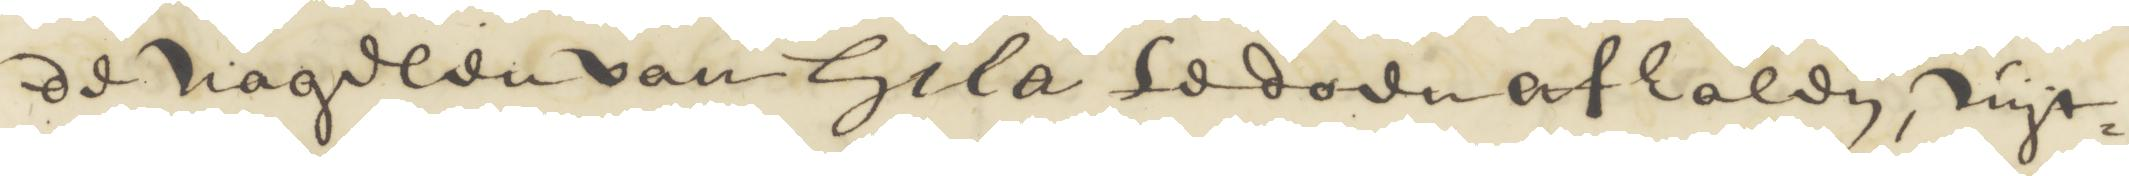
de nagelen van Hila te doen afhalen, uijt„
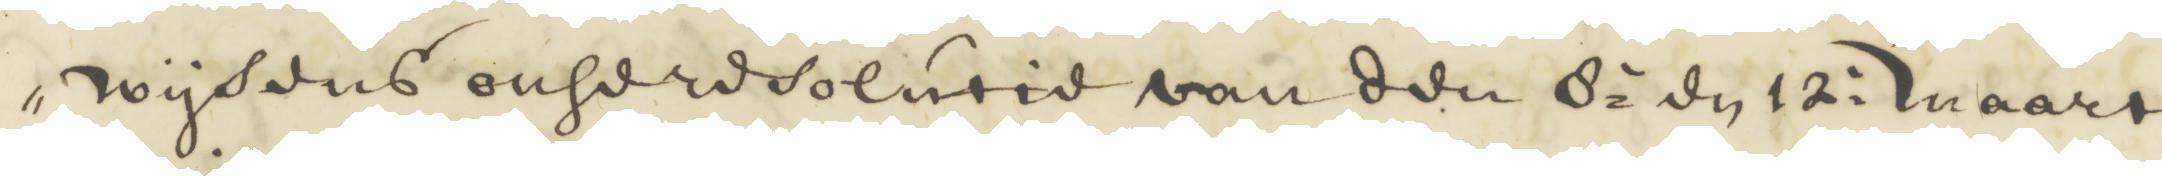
„wijsens onse resolutie van den 8=e en 12: Maart
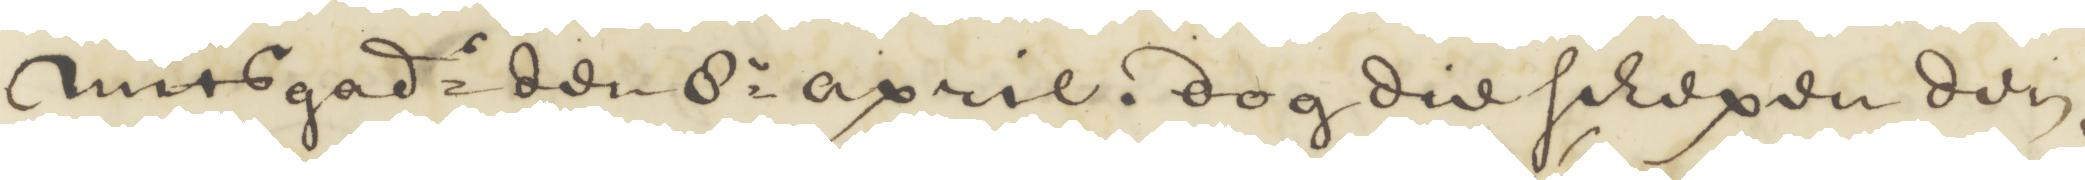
mitsgad=s den 8=e april dog die schepen den
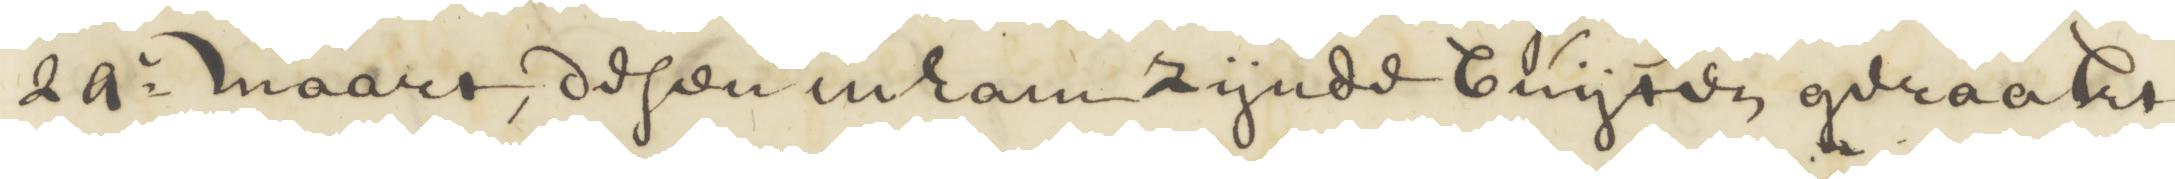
24=e Maart, desen inham zijnde buijten geraakt
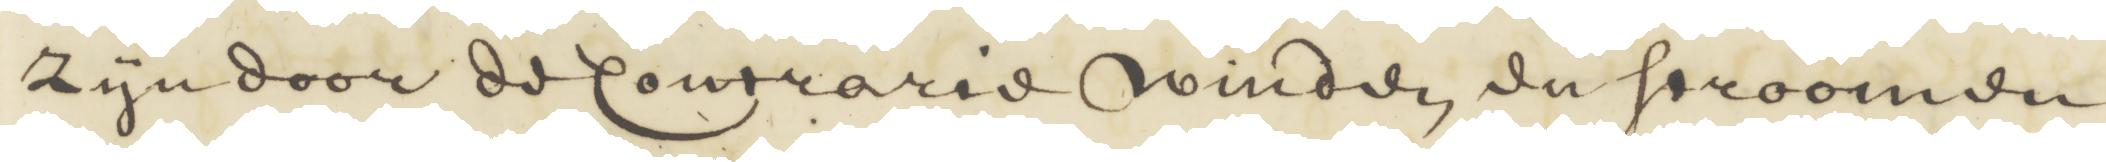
zijn door de Contrarie Winden en stroomen
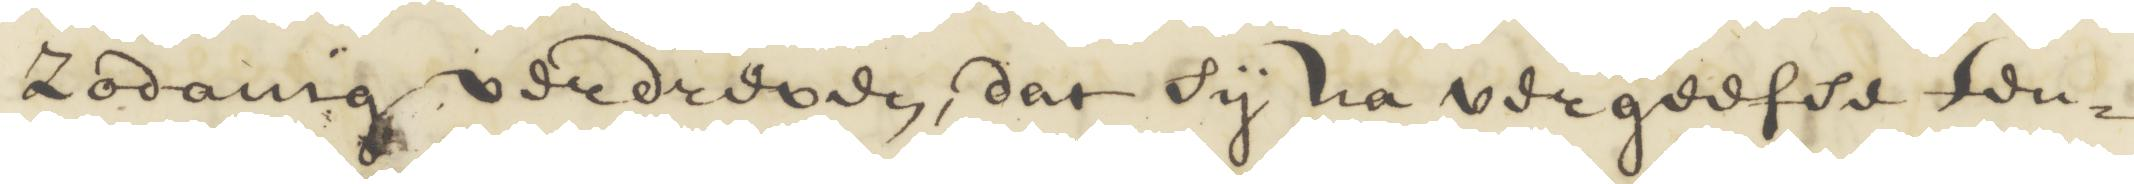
zodanig verdreven, dat sij Na vergeefse ten„
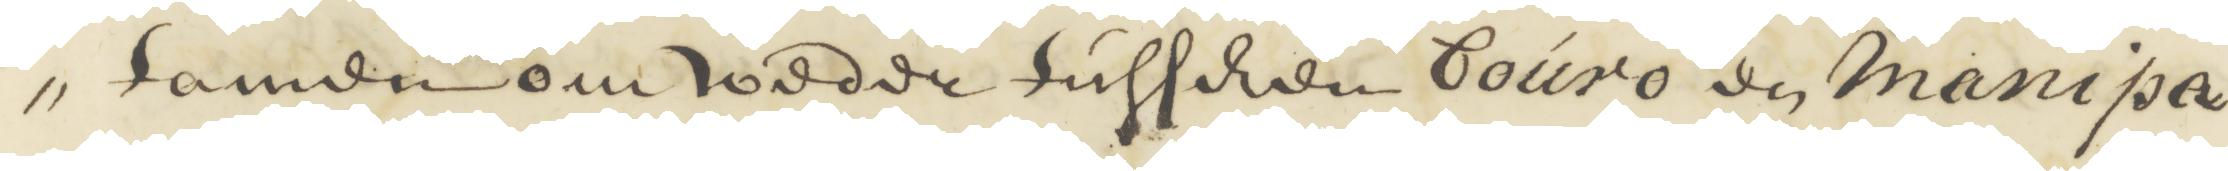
„tamen om Weder tusschen Bouro en Manipa
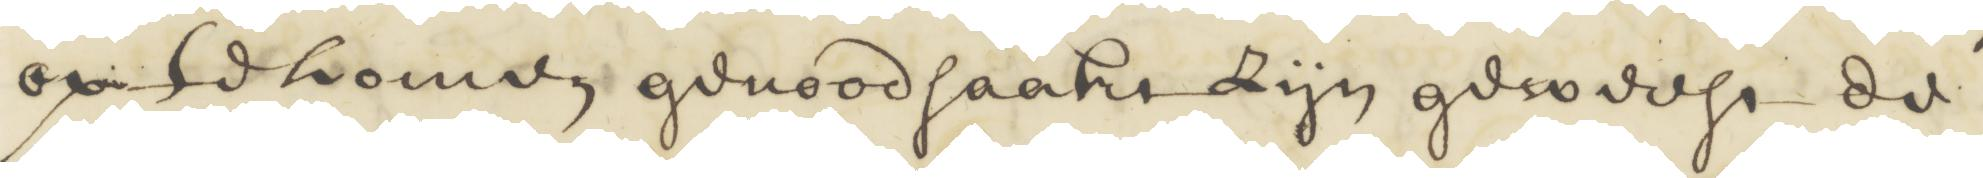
op te komen genoodsaakt zijn geweest de
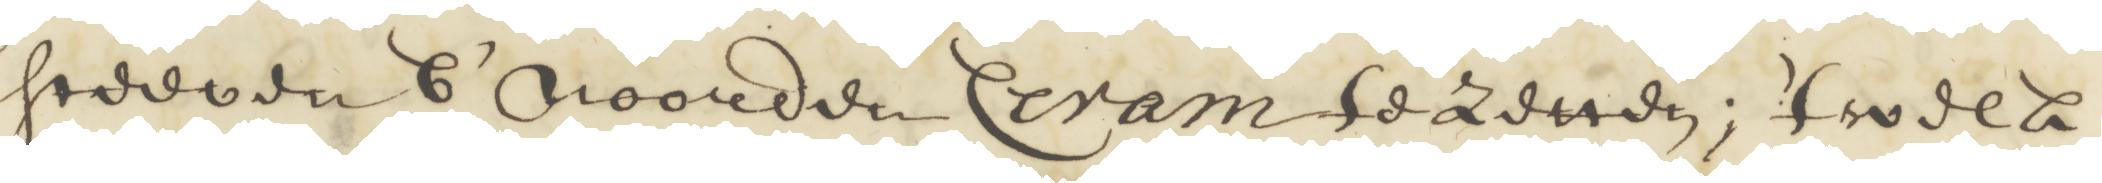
steeven b’ Noorden Ceram te zetten; ’t welk
